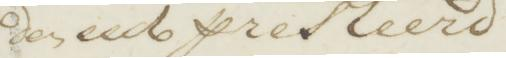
den eed presteerd
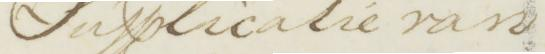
Supplicatie van
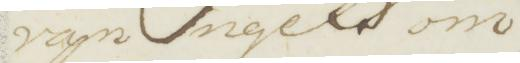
van Ingels om
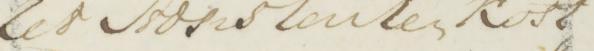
het Adsistenten kost
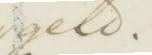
geld.
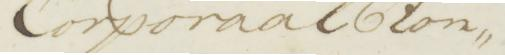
Corporaal Ron„
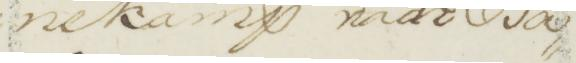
nekamp naar Ba„
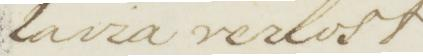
tavia verlost
